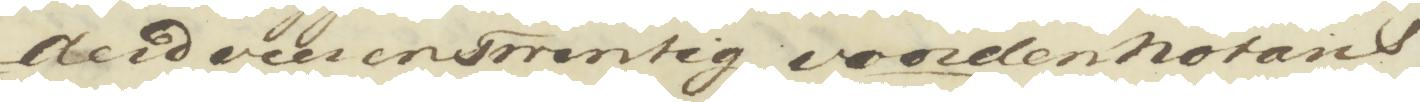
derd vier enTwintig, voor den notaris
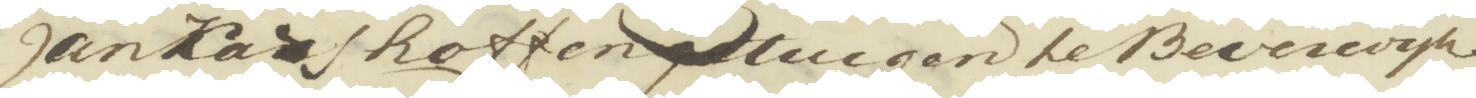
Jan Karshoff en getuigen te Beverwyk
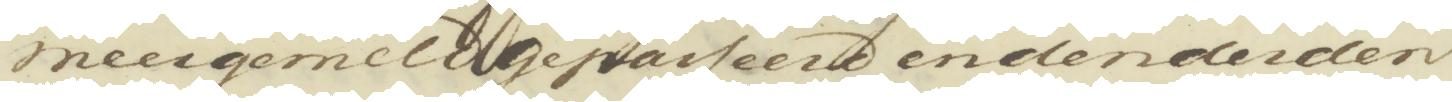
meergemeld gepasseerd en den derden
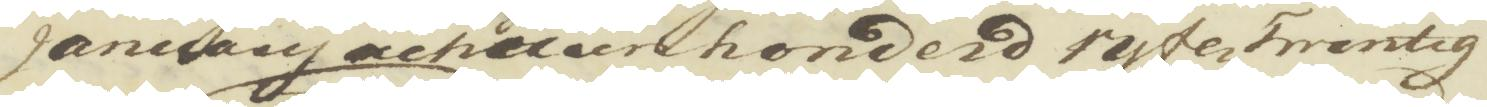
January achttienhonderd vyfen Twintig
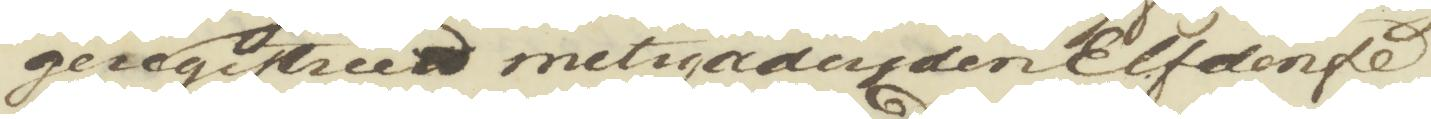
geregistreerd mitsgaders den Elfden fe
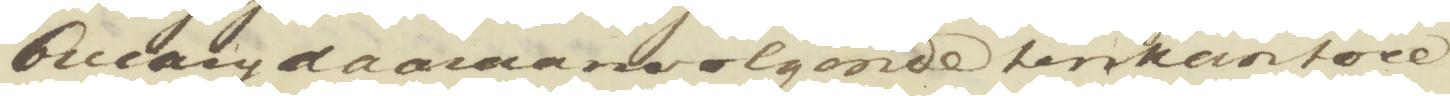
bruary daaraanvolgende ten kantore
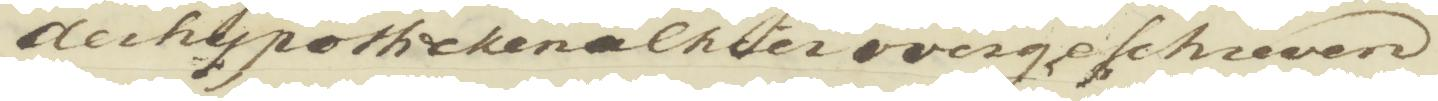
de hypotheken alhier overgeschreven
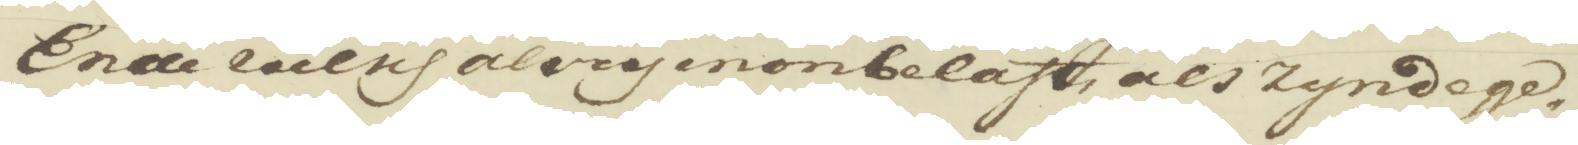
Ende zulks al vry en onbelaft, als zynde ge„
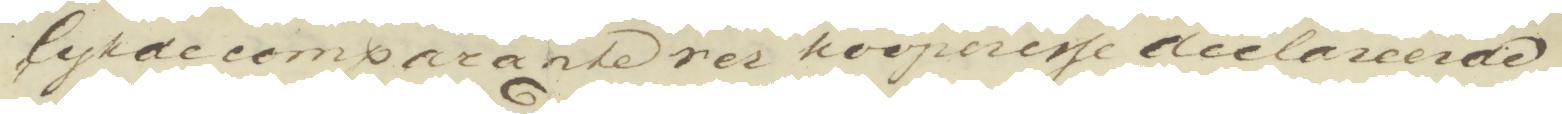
lyk de comparante verkooperesse declareerde
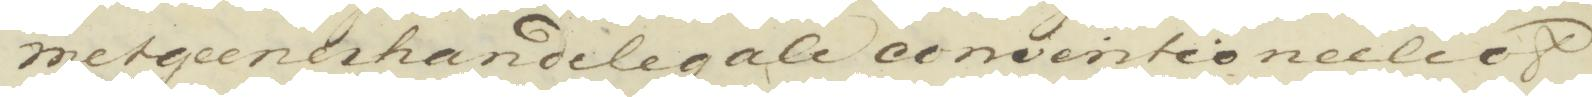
met geenerhande legale conventioneele of
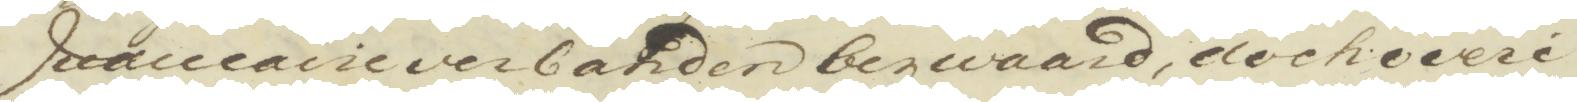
Judiccaire verbanden bezwaard, doch overi
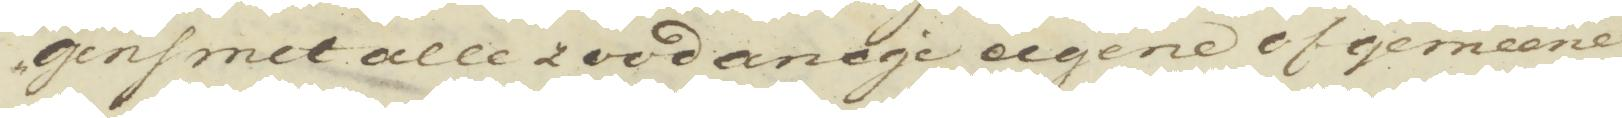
„gens met alle zoodanige eigene of gemeene
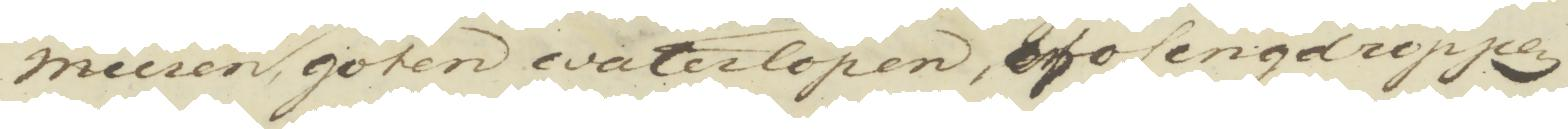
meeren, goten waterlopen, of osengdroppen
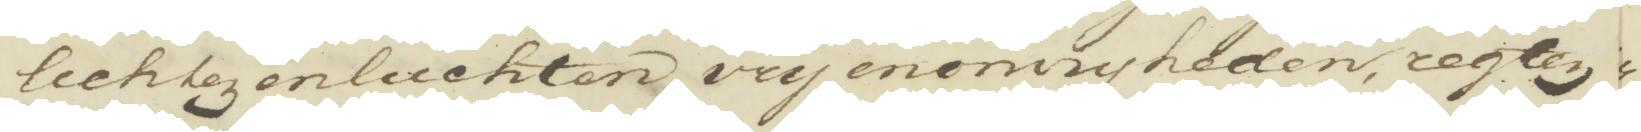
lichten en luchten, vry en onvryheden, regten
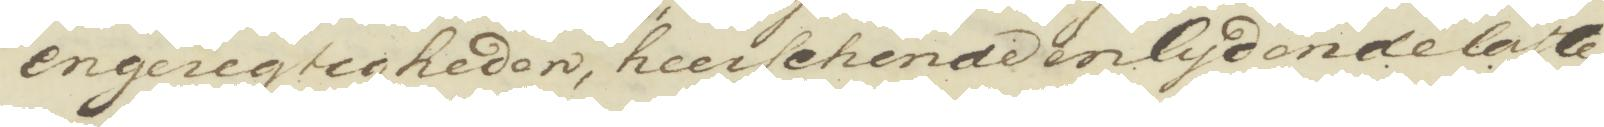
engeregtigheden, heerschende en lydende lasten
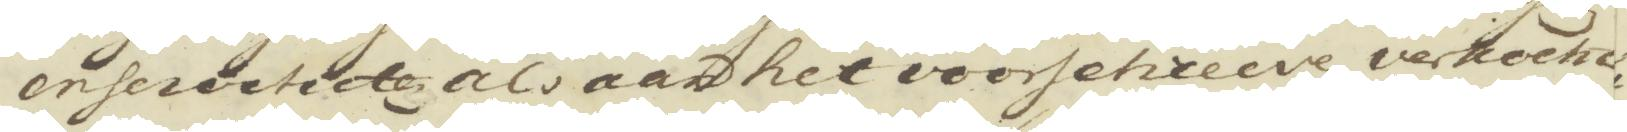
en servituten als aan het voorschreeve verkocht
